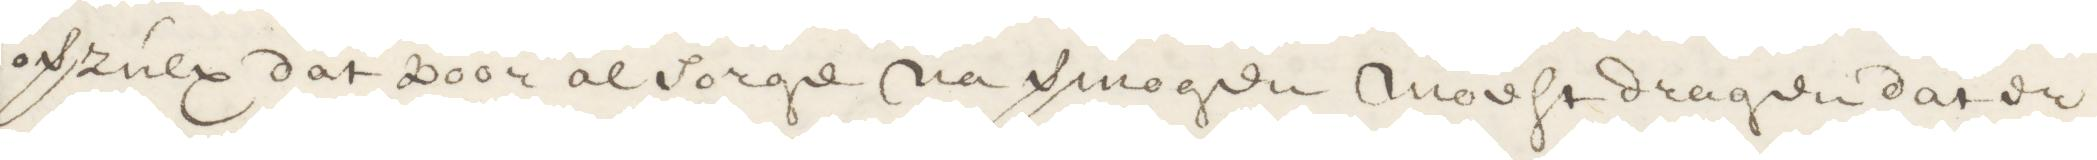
overzulx dat voor al sorge na vermogen moest dragen dat' er
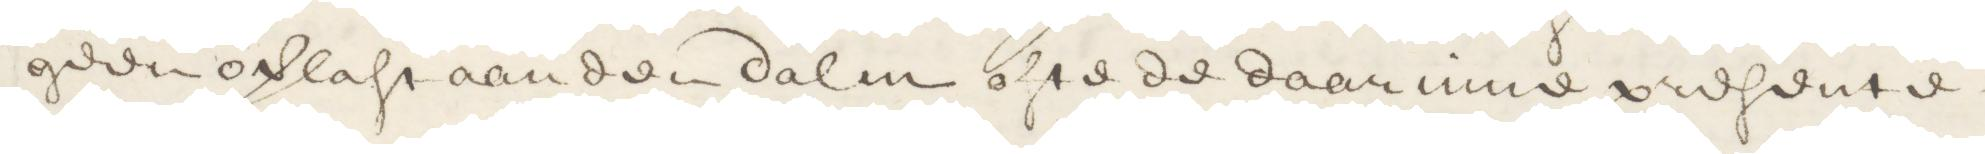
geen overlast aan den dalm ofte de daar inne presente
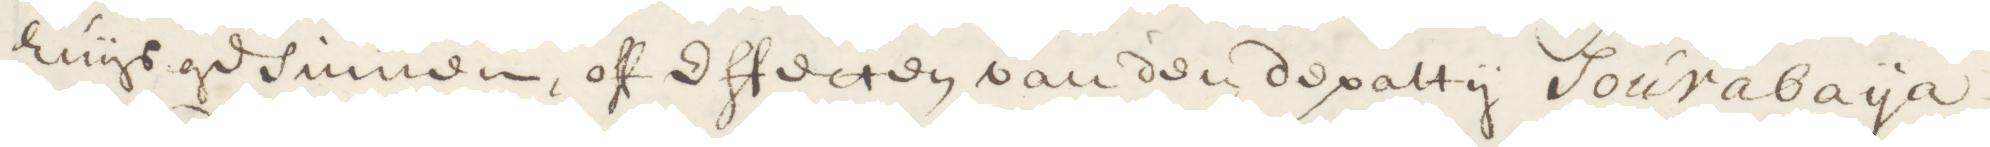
huijs gesinnen, off Effecten van den depattij sourabaija
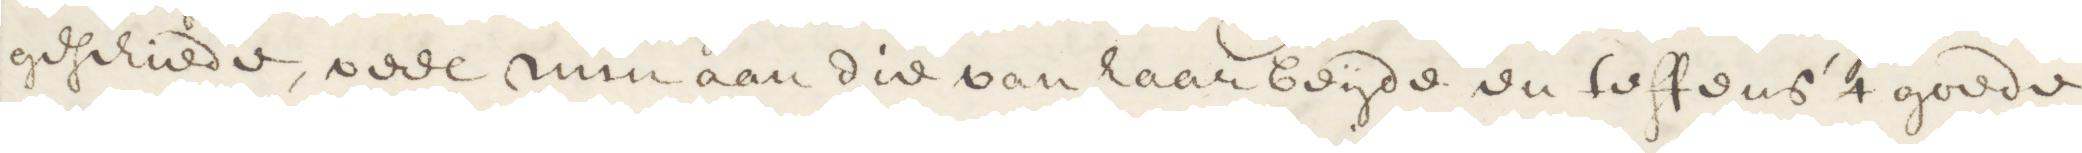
geschiede, veel min aan die van haar beijde en teffens 't goede
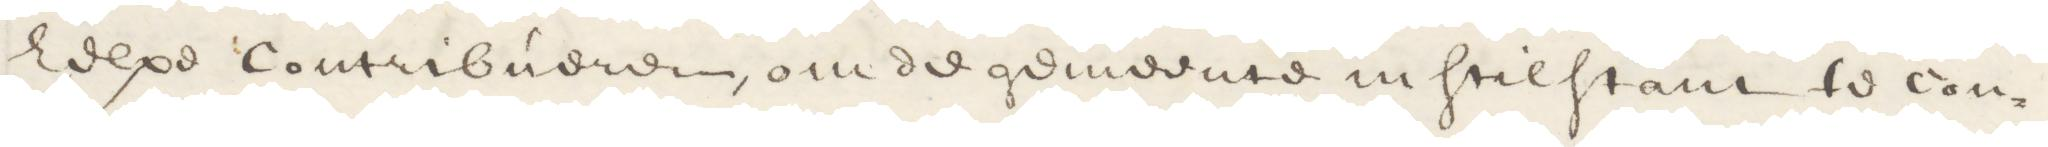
helpe contribueren, om de gemeente in stilstant te con=
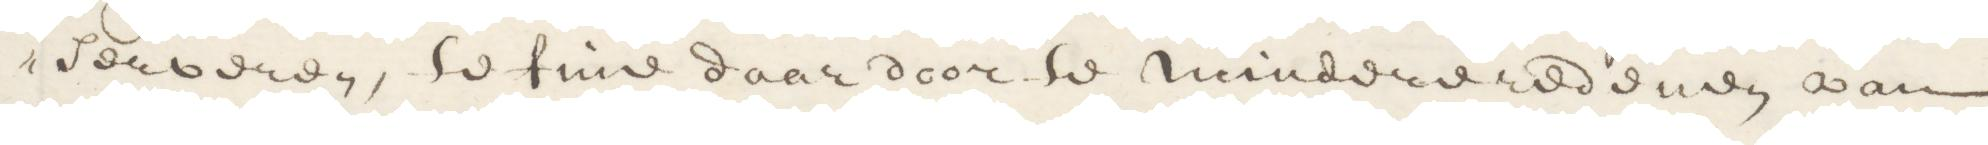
„ serveren, te fine daar door te mindere redenen van
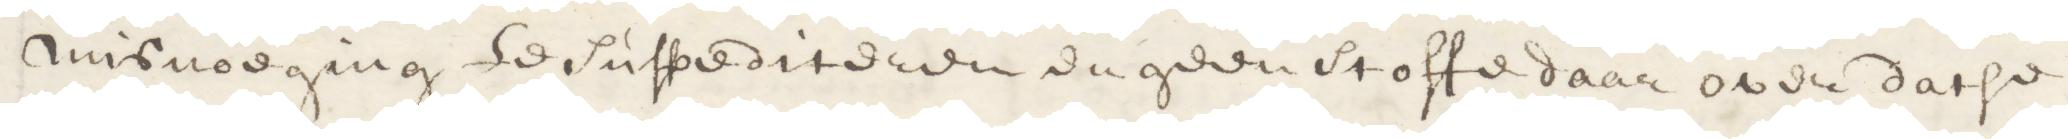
misnoeging te suppediteren en geen stoffe daar over datse
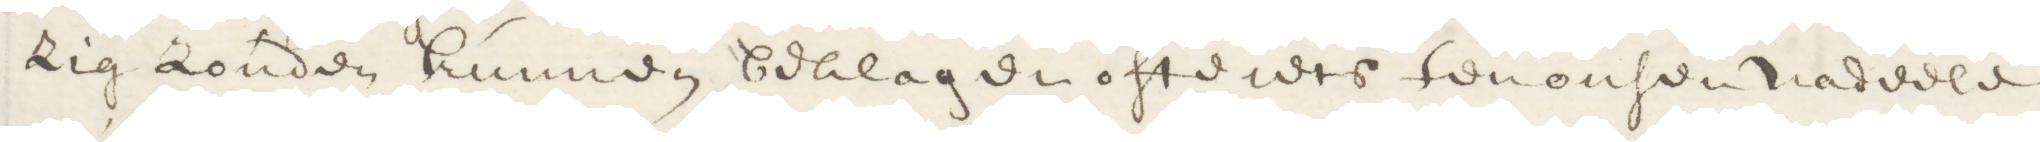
zig zouden kunnen beklagen ofte iets ten onsen nadeele
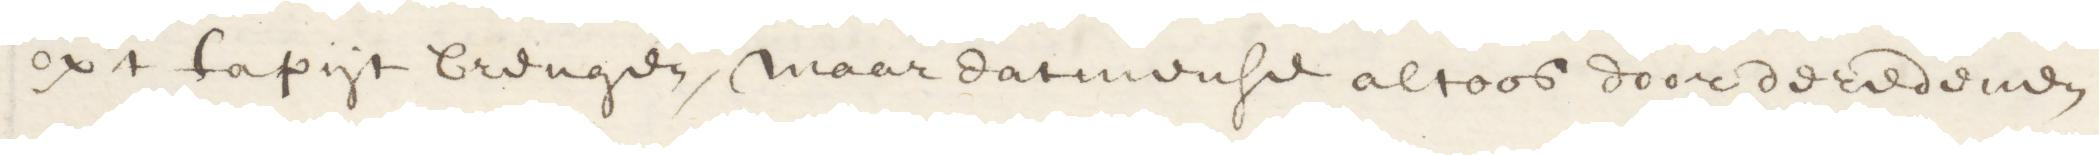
op ’t tapijt brengen, maar datmense altoos door deredenen
